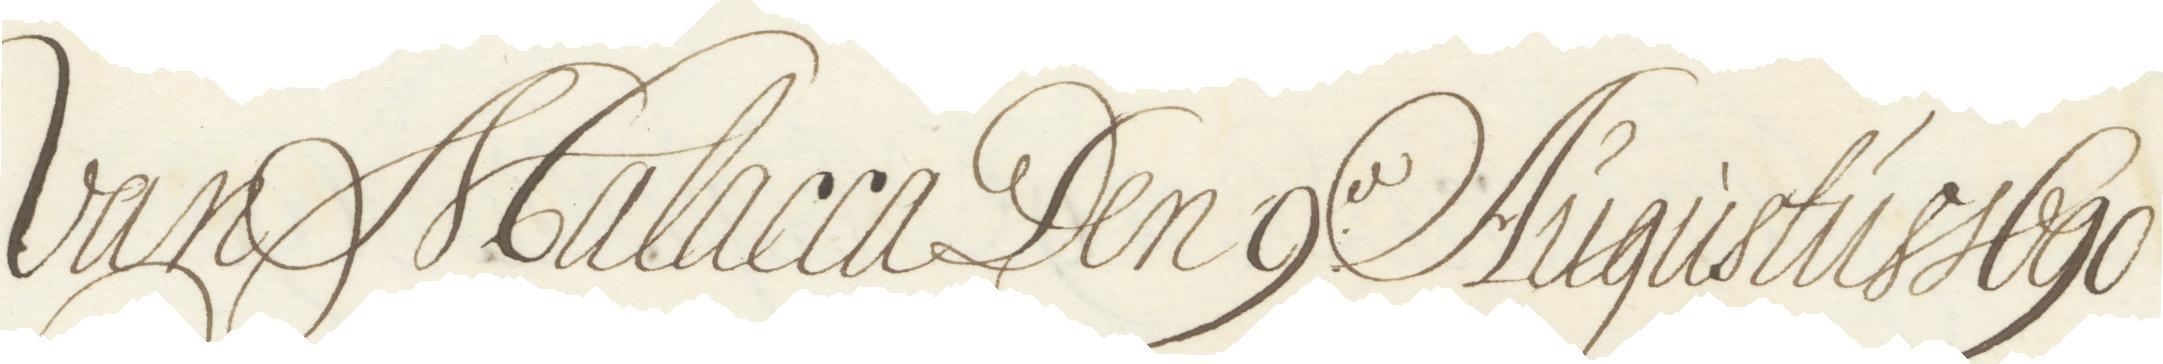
Van Malacca Den 9:e Augustus 1690
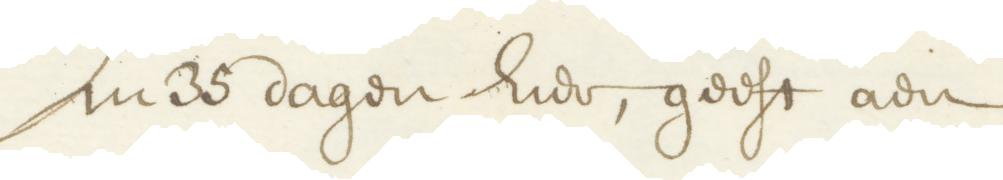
in 35 dagen hier, geeft aen
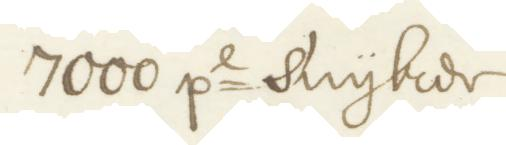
7000 p=l suijker
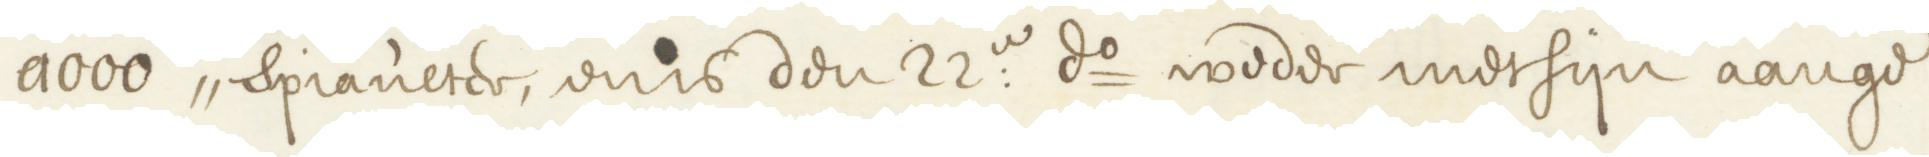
4000 „spiaulter, en is den 22:e d=o weder met sijn aange
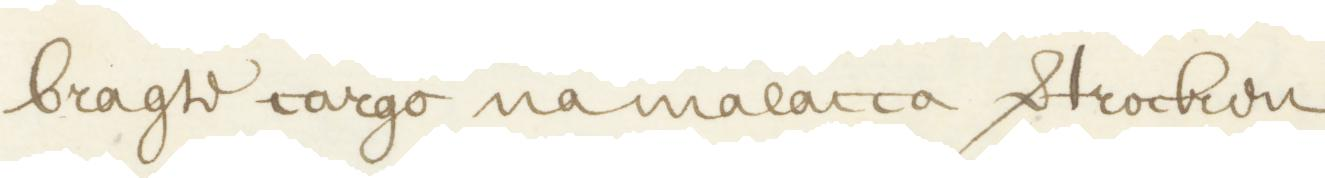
bragte cargo na malacca vertrocken
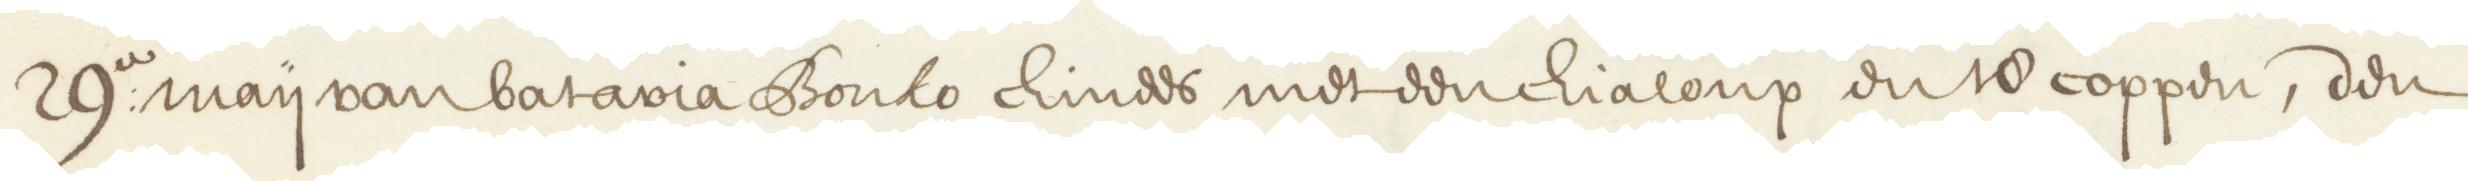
29:e maij van batavia Bonko chinees met een chialoup en 18 coppen, den
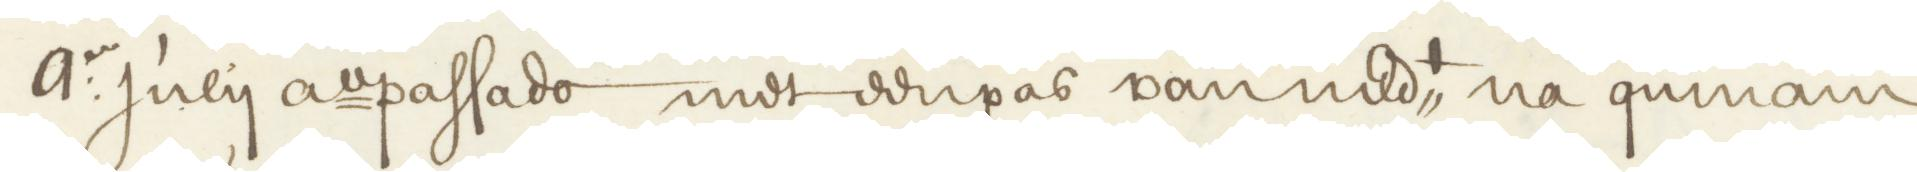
4:en Julij a=n passado met een pas van u Ed„t na quinam
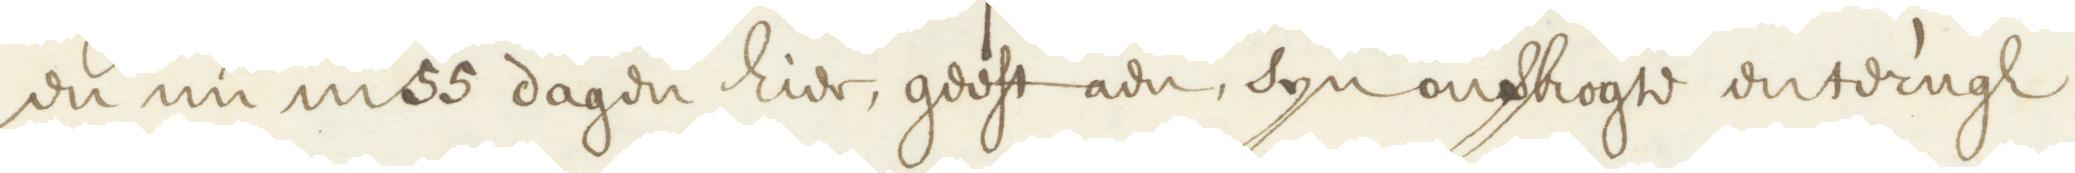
en nu in 55 dagen hier, geeft aen, syn onverkogte en terugh
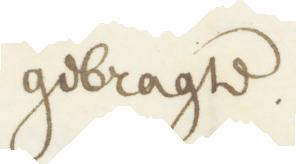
gebragte.
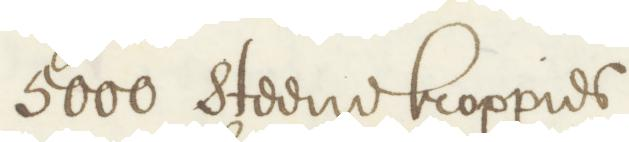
5000 steene koppies
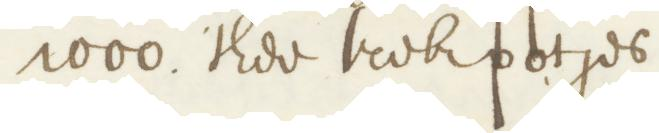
1000. thee trekpotjes
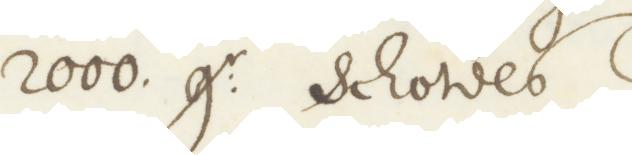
2000. g:r schotels
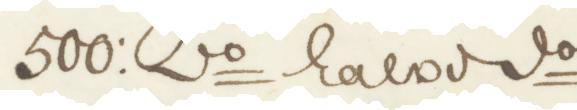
500: d=o halve d=o
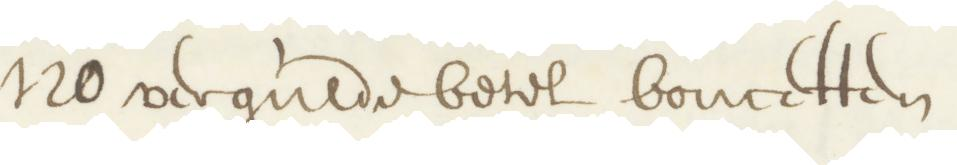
120 vergulde betel boucetten
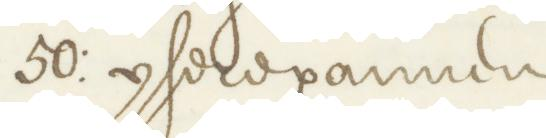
50: ysere pannen
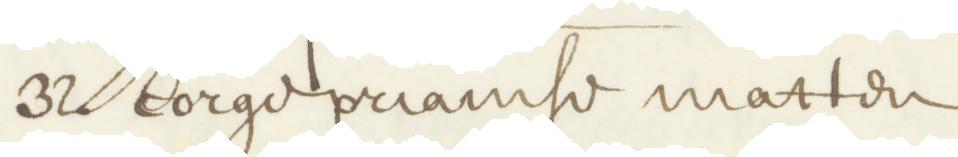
32. corgepriamse matten
